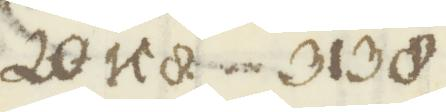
20 158. 3138
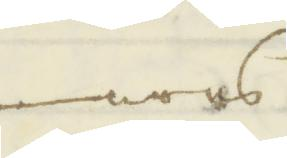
_o _o vors
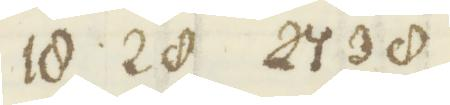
18 28 27 38
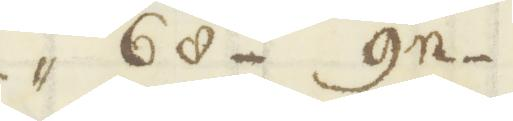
„ 68 – 92–
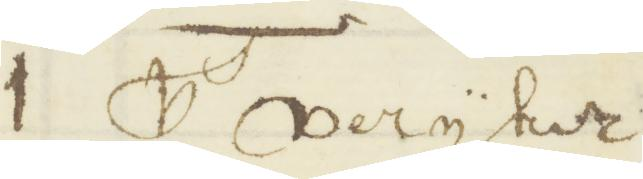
1 ps verijker
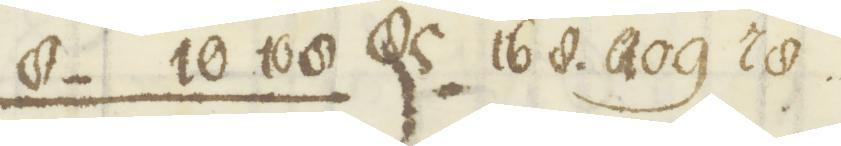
98– 10 108 85 168. 409 r8.
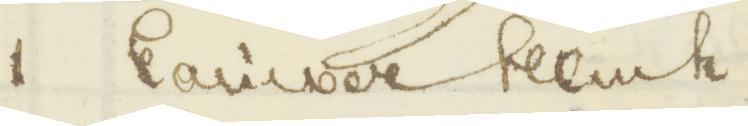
1 hauwer klink
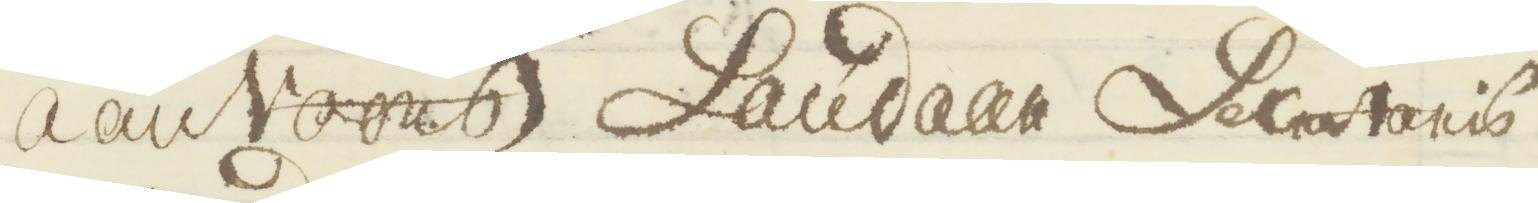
aan voorsz Saudaar Secataris
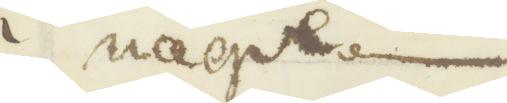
9½ nagelen
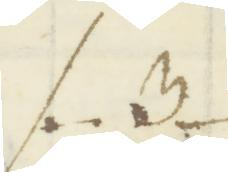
ƒ – 3
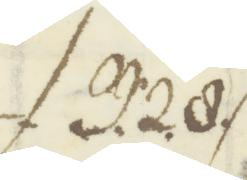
ƒ3.2.8ƒ
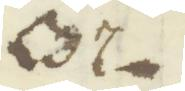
537–
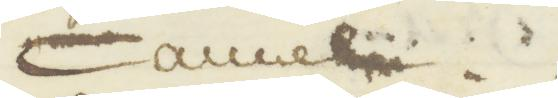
Caneel -
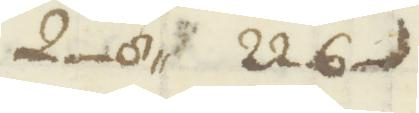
2 – 8 „ 22. 6–
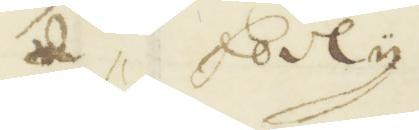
2 „ foelij
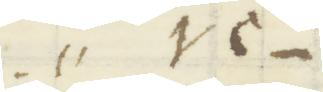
- „ 15 –
